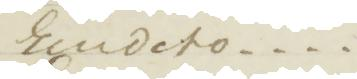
Een dito . . . .
